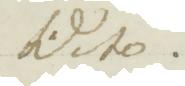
Dito. . . . . . . .
